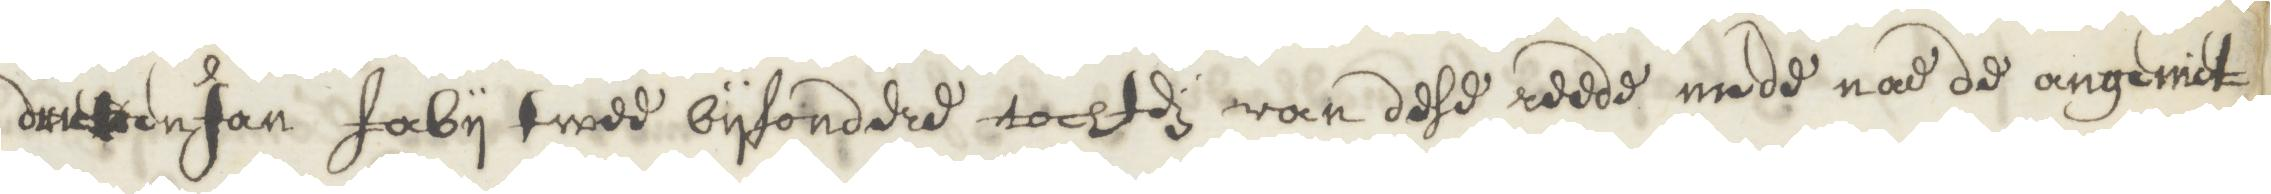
drie en Jan fabij twee bijsondere tochten van dese reede mede nae de angeniet
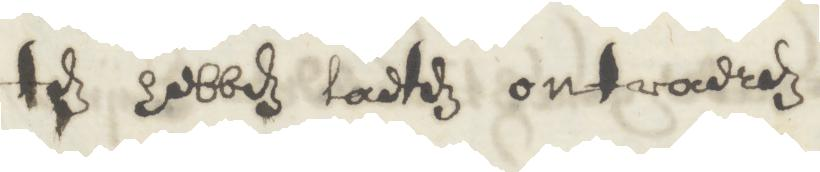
ten hebben laeten ontvaeren
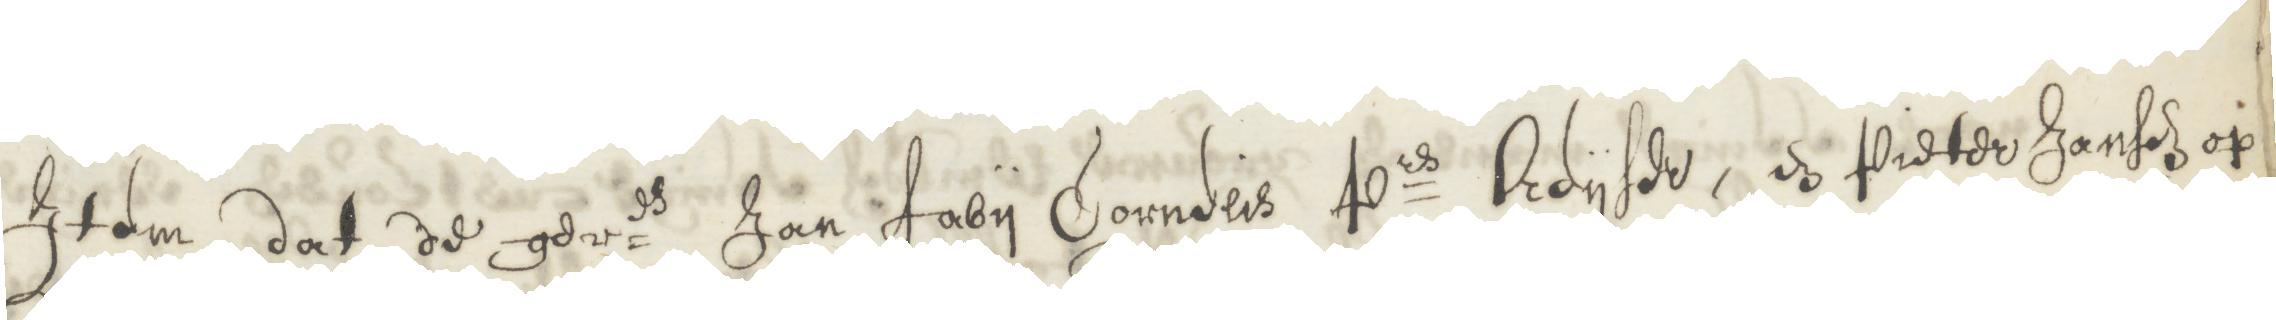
Item dat de gev=en Jan fabij Cornelis P=rs keijser, en pieter Jansen op
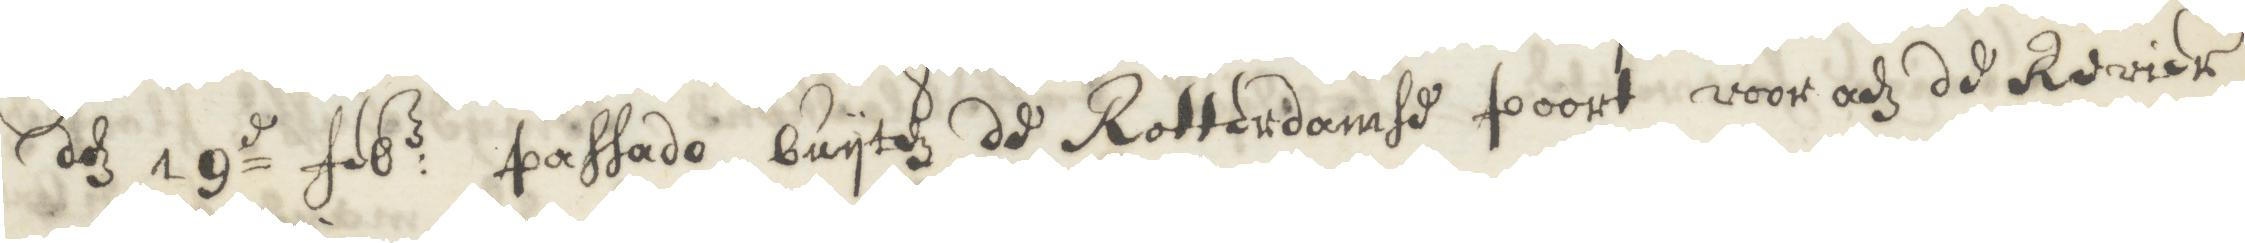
den 19=e feb: passado buijten de Rotterdamse poort voor aen de Revier
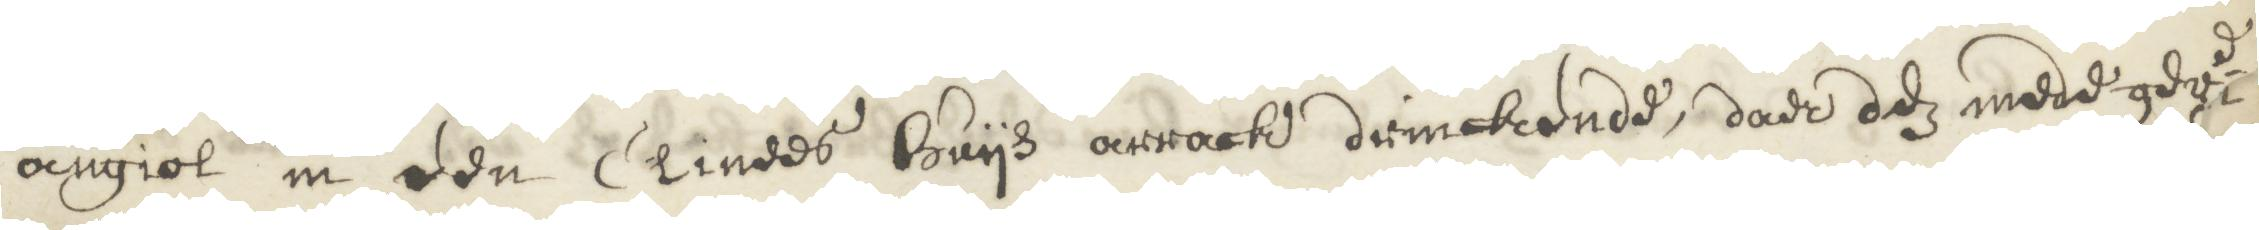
angiol in Een Chinees huijs arrack drinckende, daer den mede gev=e
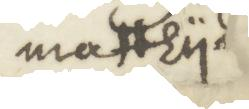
matthij
